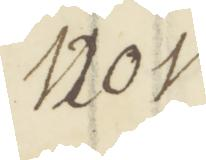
1201
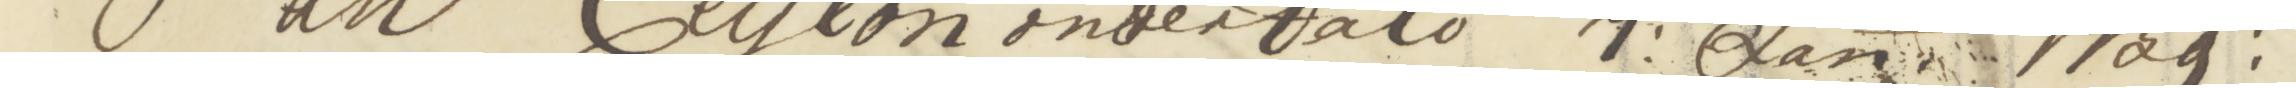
Van Ceijlon onder dato 7: Jan 1729:
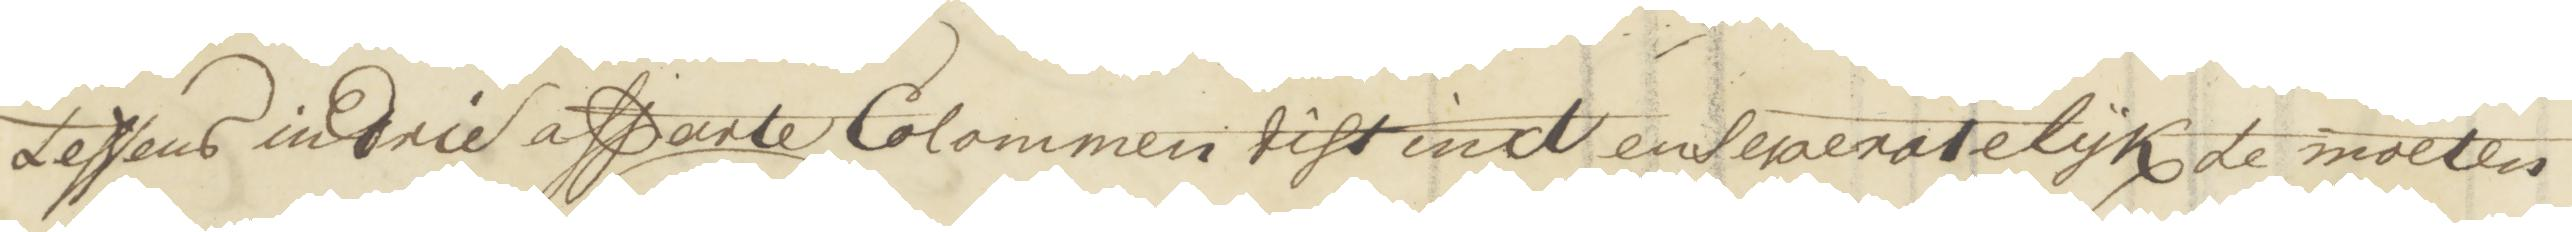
teffens in drie apparte Colommen distinct en seperatelijk te moeten
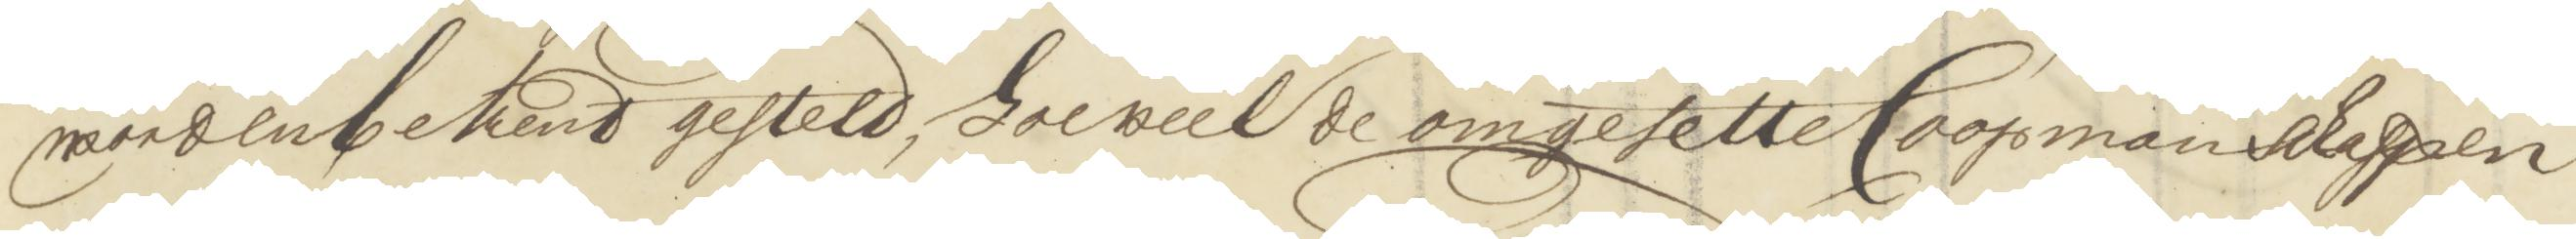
worden bekend gesteld, hoeveel de omgesette Coopmanschappen
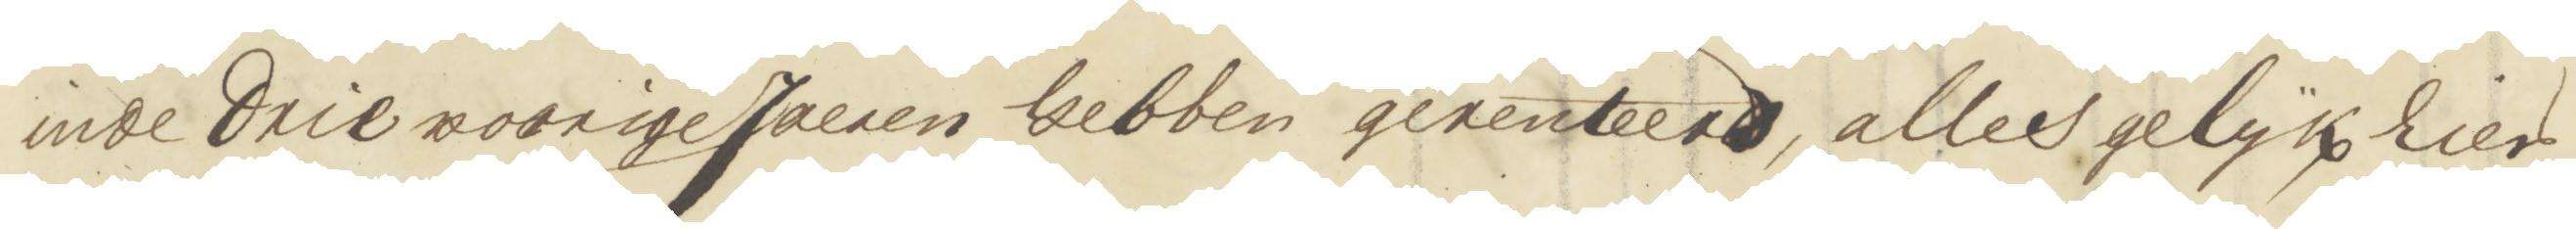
inde drie voorige Jaeren hebben gerenteerd, alles gelijk hier
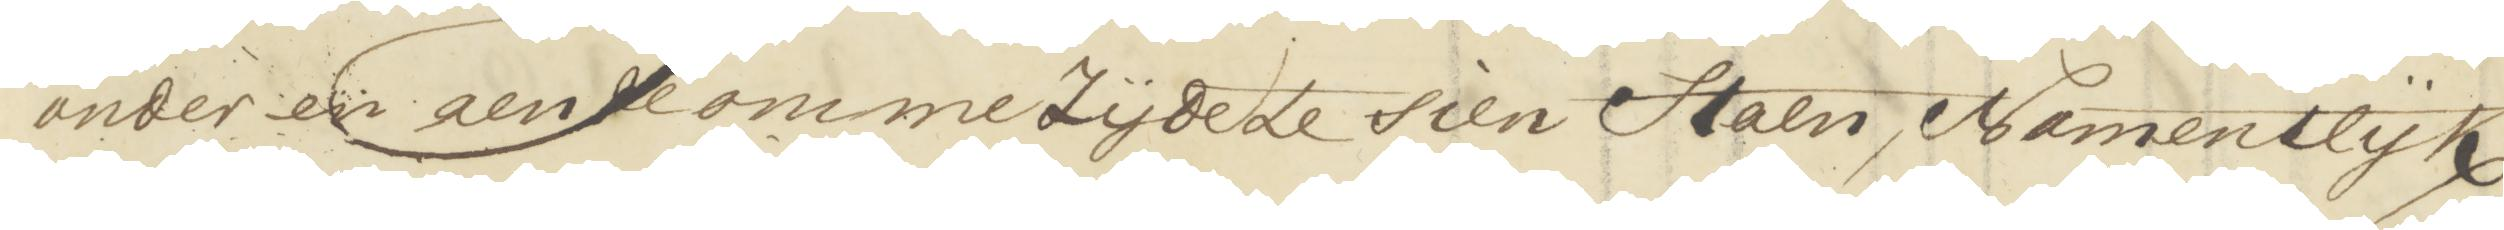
onder en aen de ommezijde te sien staen, Namentlijk
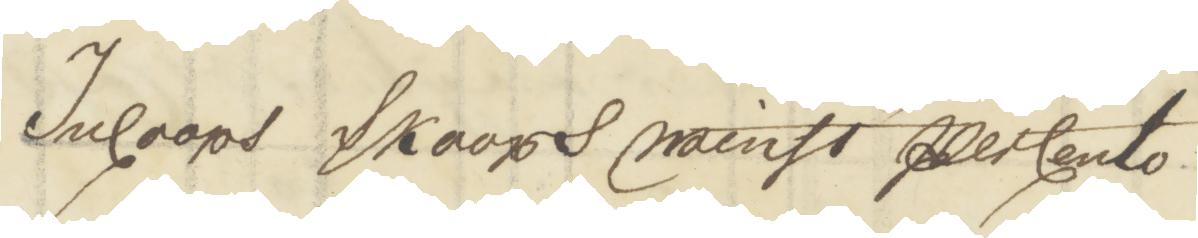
Incoops verkoops winst percento
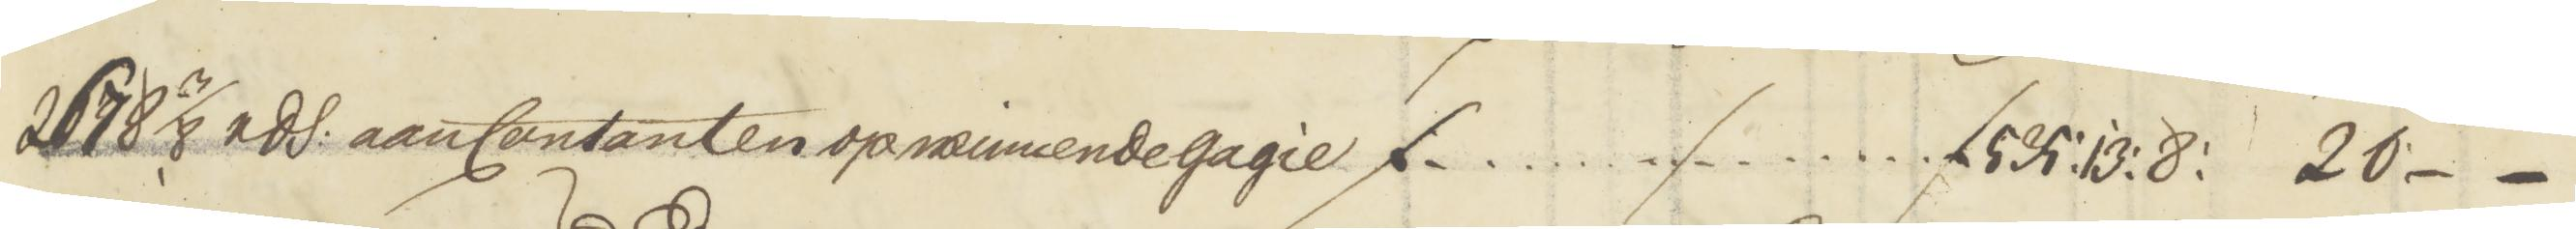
2678 3/8 rds: aan contanten op winnende gagie ƒ . . . . . . . ƒ . . . . . . ƒ535:13:8: 26— —
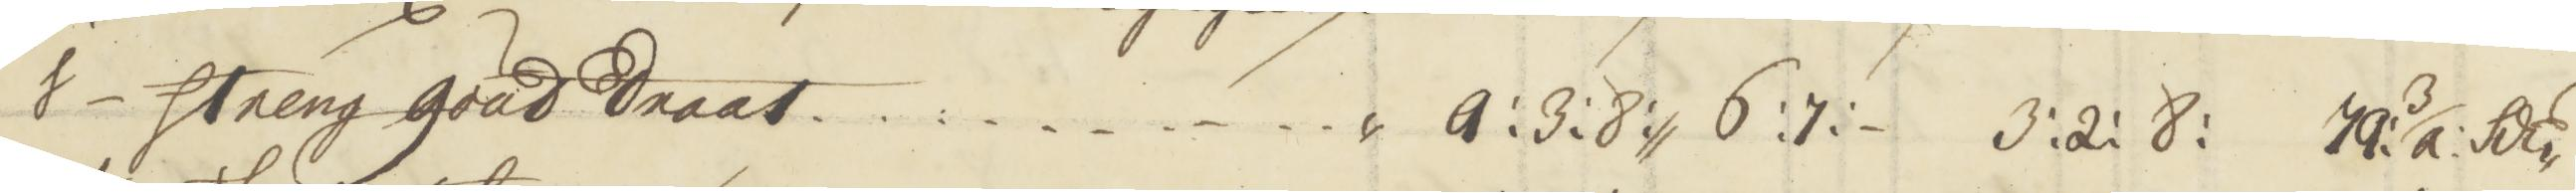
1 – streng goud draat . . . . . . . . . . „ 4:3:8:„ 6:7:- 3:2: 8: 74: ¾: sch„s
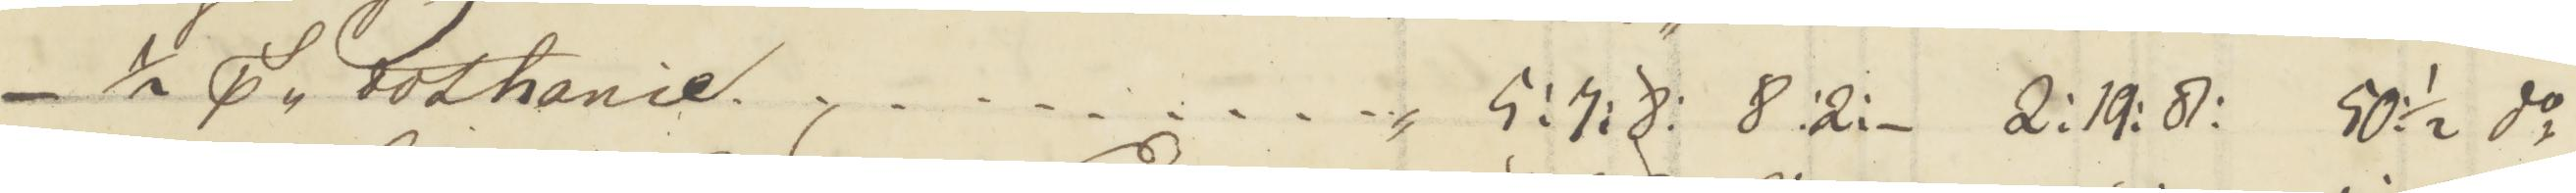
_½ p„s dothanie . . . . . . . . . . . . „ 5:7:8: 8:2:- 2:14:8: 50:½ d„o
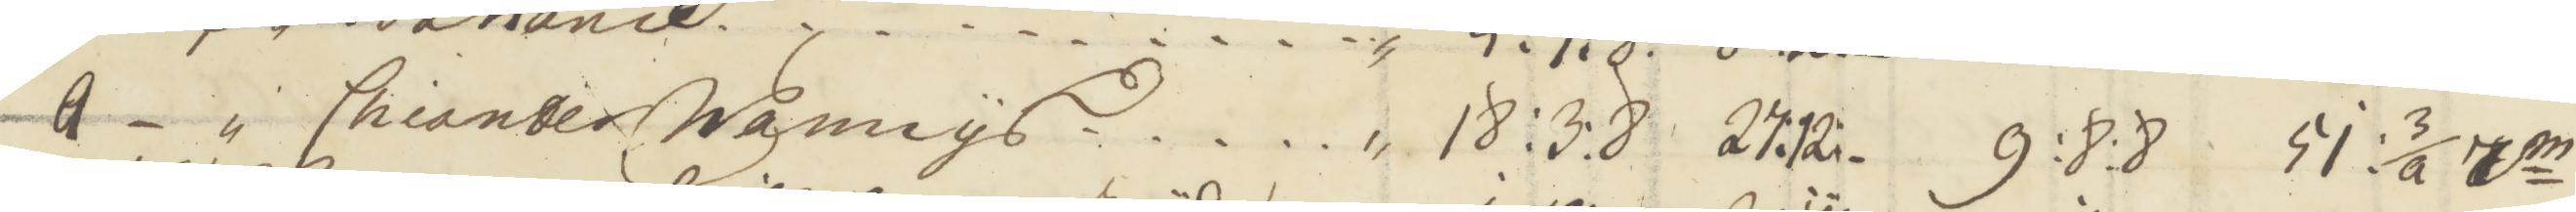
4 – „ Chiander Wannijs . . . . . „ 18:3:8: 27:12:- 9:8:8 51: ¾ r=m
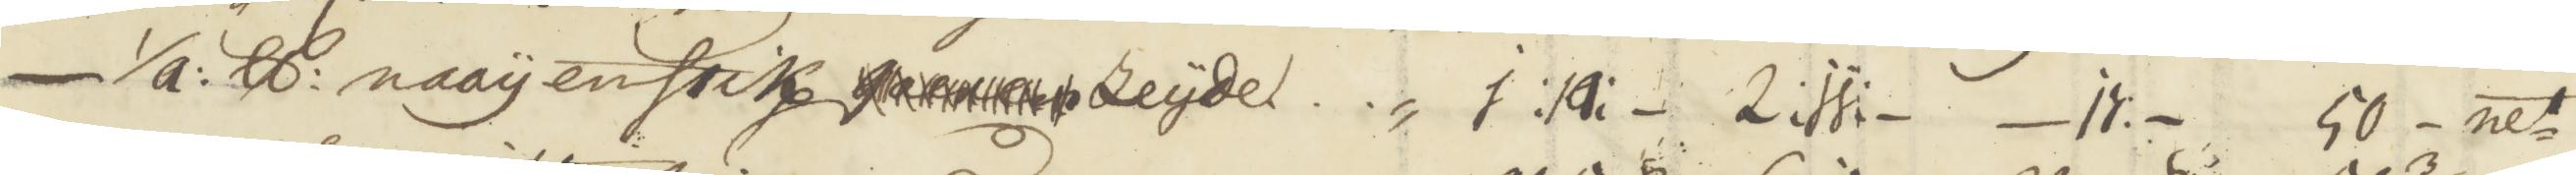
— ¼: lb: naaij en stik zeijde . . . „ 1:14:- 2:11: - - 17:- 50 - nl=t
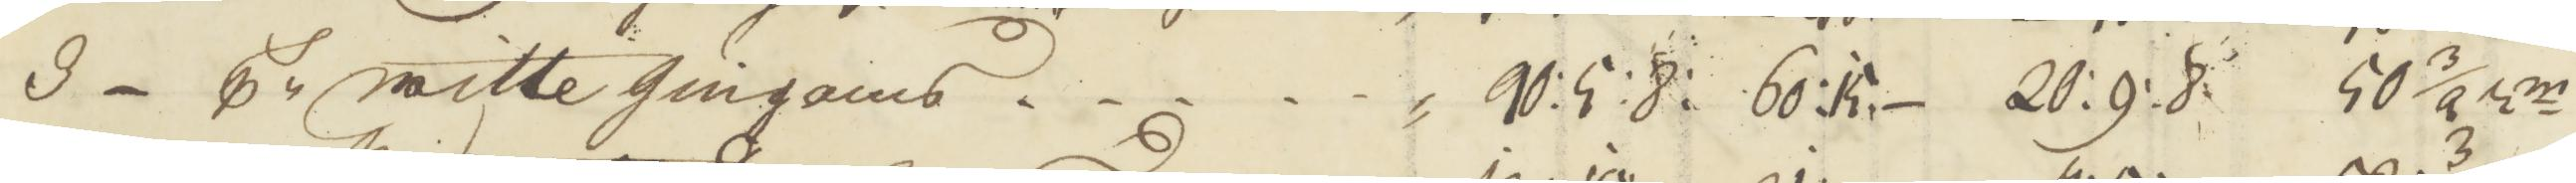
3 - p„s witte gingams . . . . . . „ 40:5:8: 60:15:- 20:9:8: 50¾ r=m
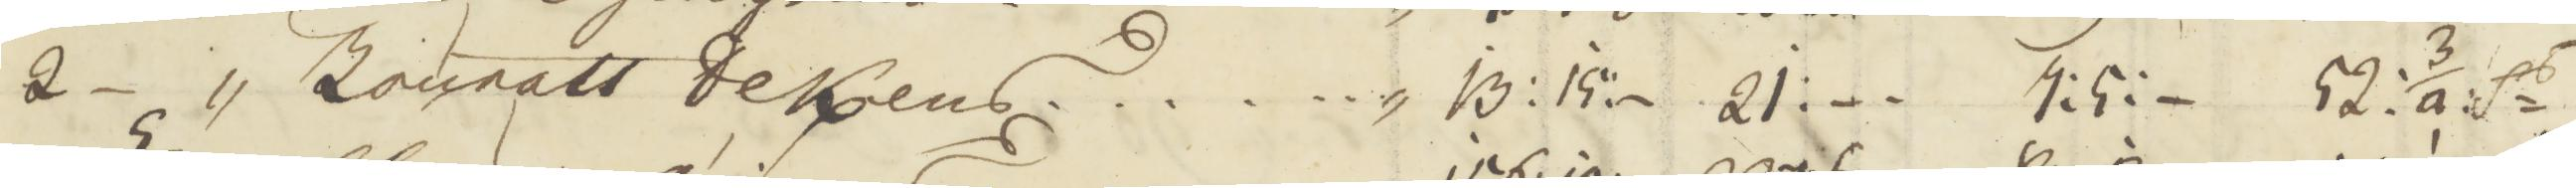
2 – „ zourats dekens: . . . . . . „ 13:15: - 21:- - 7:5:- 52: ¾: s=s
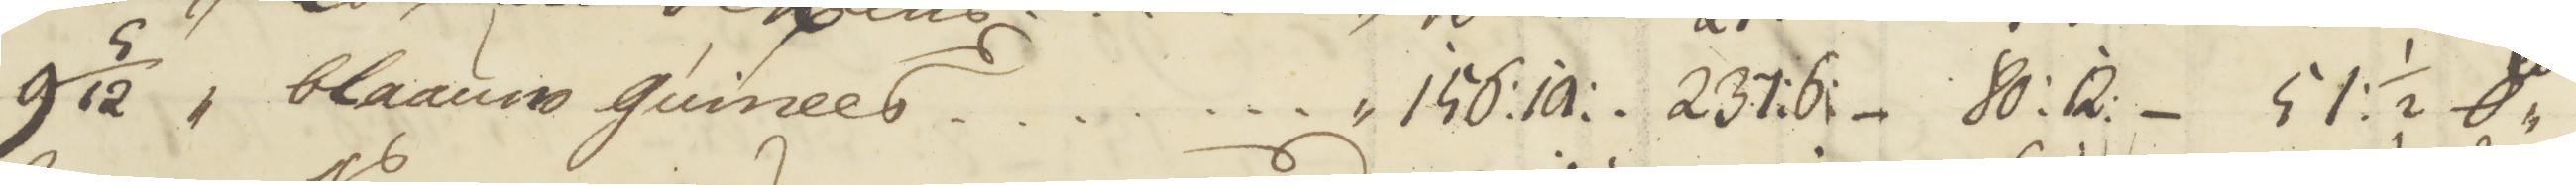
9 5/12 „ blaauw guinees . . . . . . . „ 156:14:- 237:6:- 80:12:- 51: ½ d„o
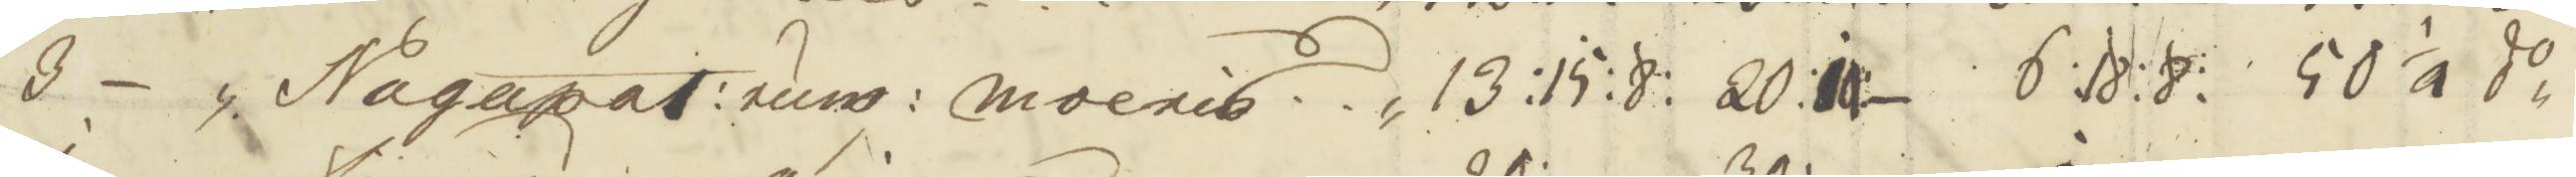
3 - „ Nagapat: ruw: moeris . . „ 13:15:8: 20:14:_ 6:18:8: 50¼ d„o
